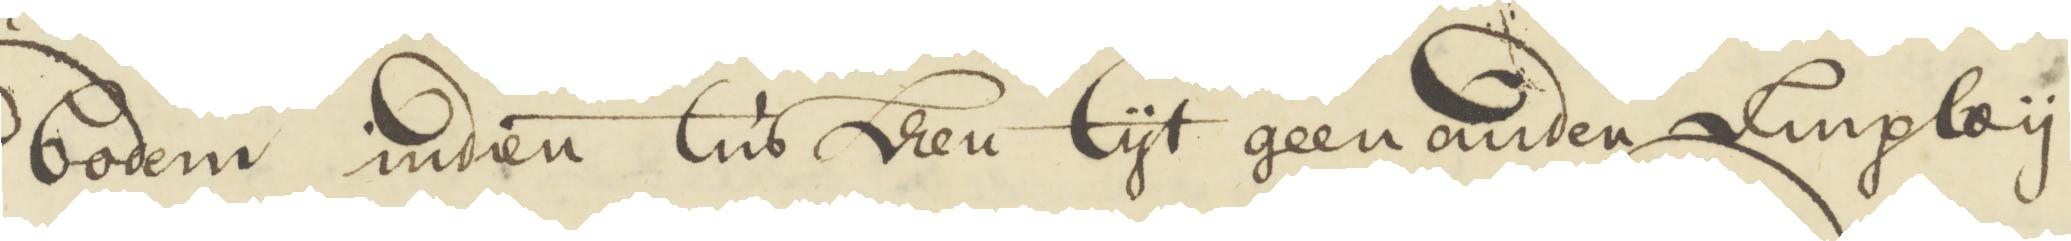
bodem indien tusschen tijt geen ander Emploij
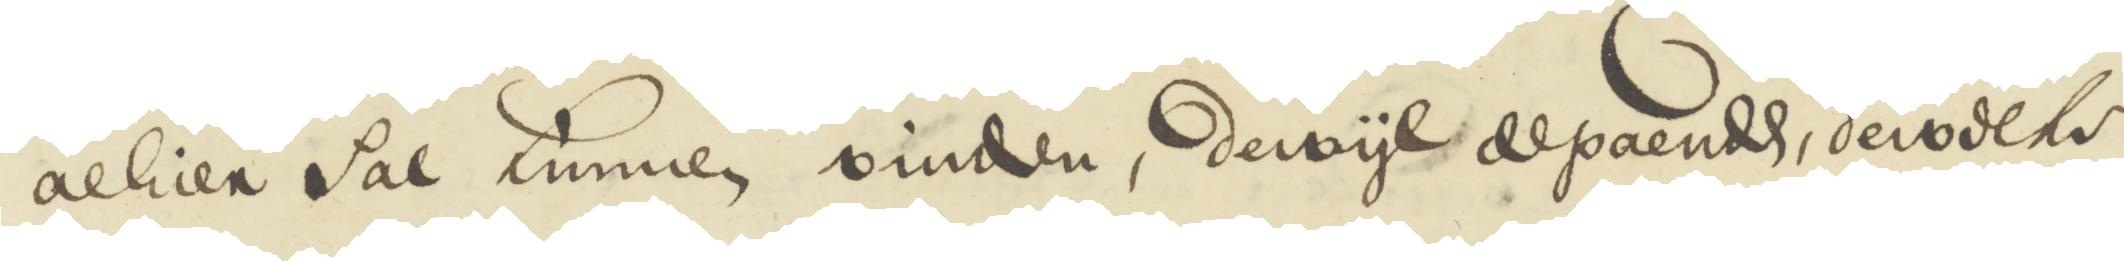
alhier Sal kunnen vinden, dewijl de paerden, dewelke
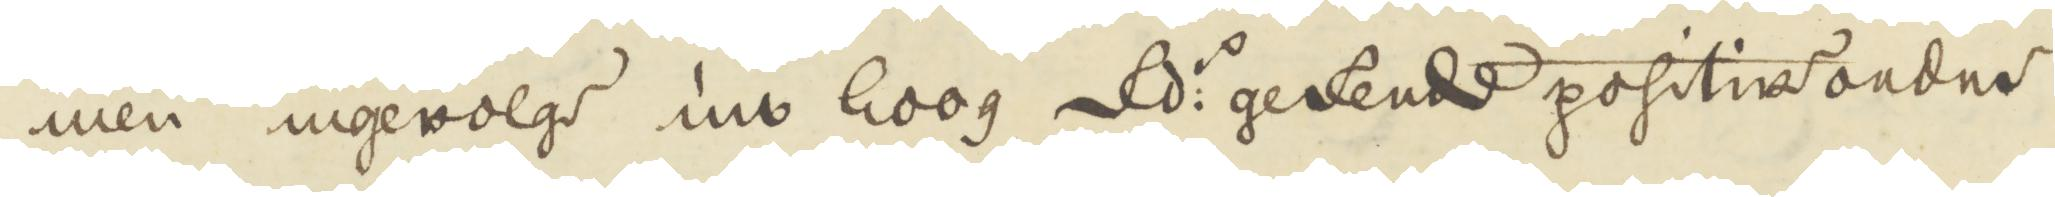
men ingevolge uw hoog Ed:s geeerde positive ordre
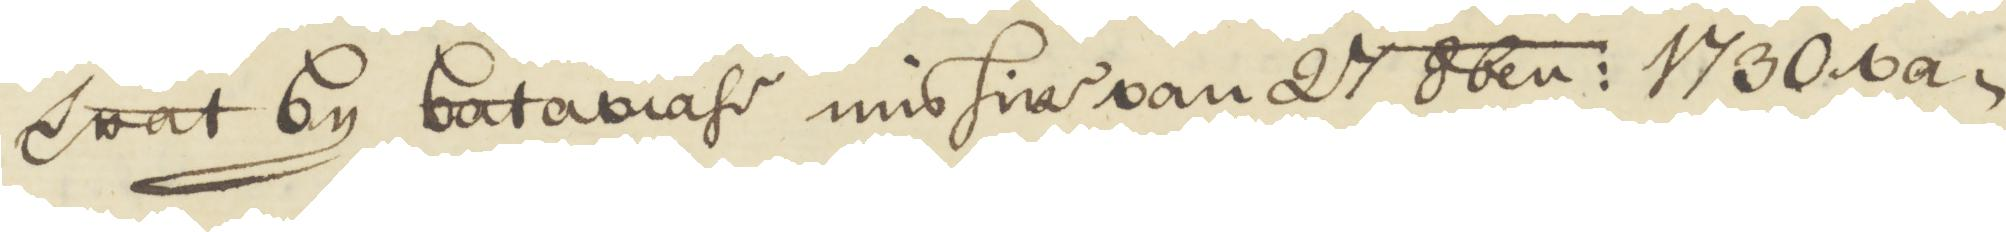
vervat by bataviase missive van 27 8ber: 1730 van
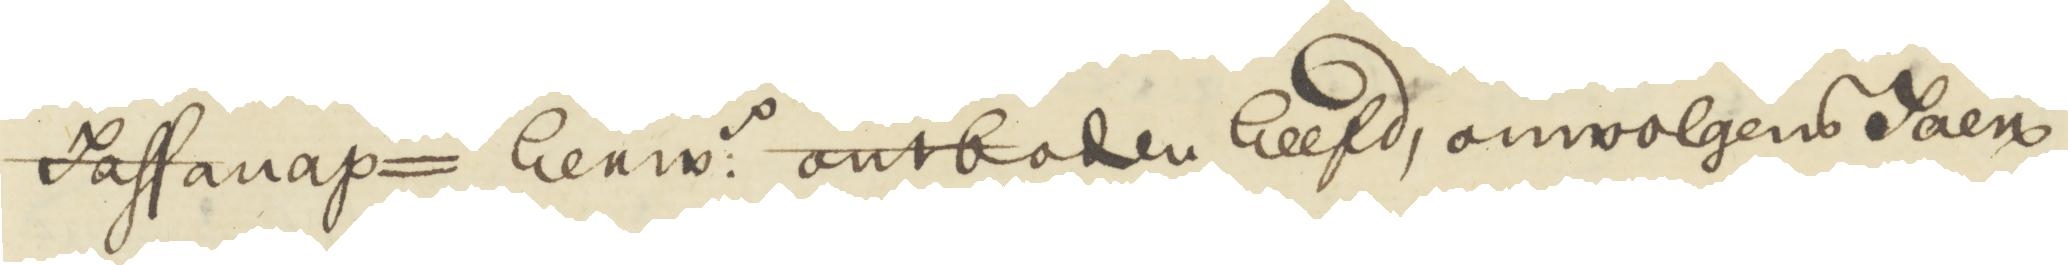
Iaffanap=m herw:s ontboden heefd, omvolgens Iaer
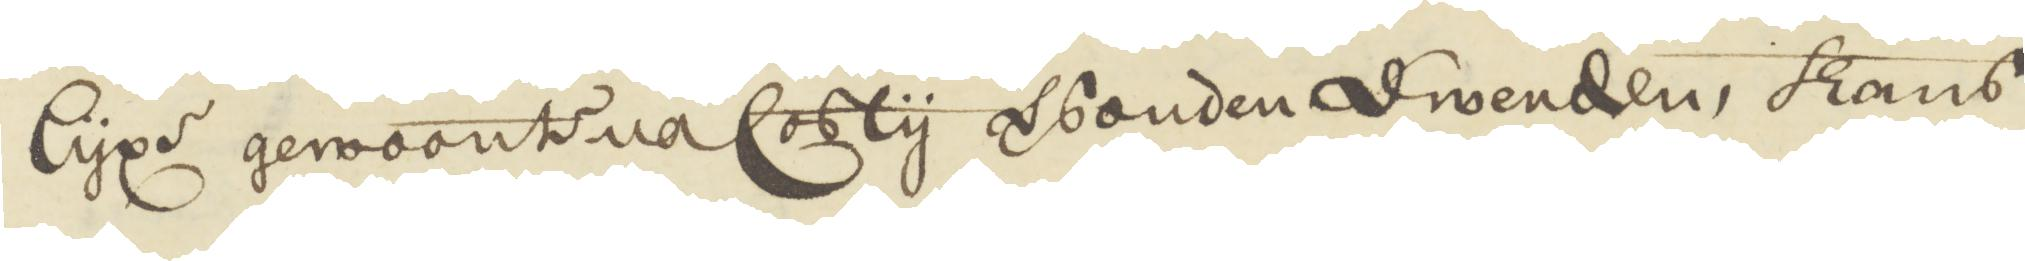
lijxe gewoonte na Costij versonden te werden, thans
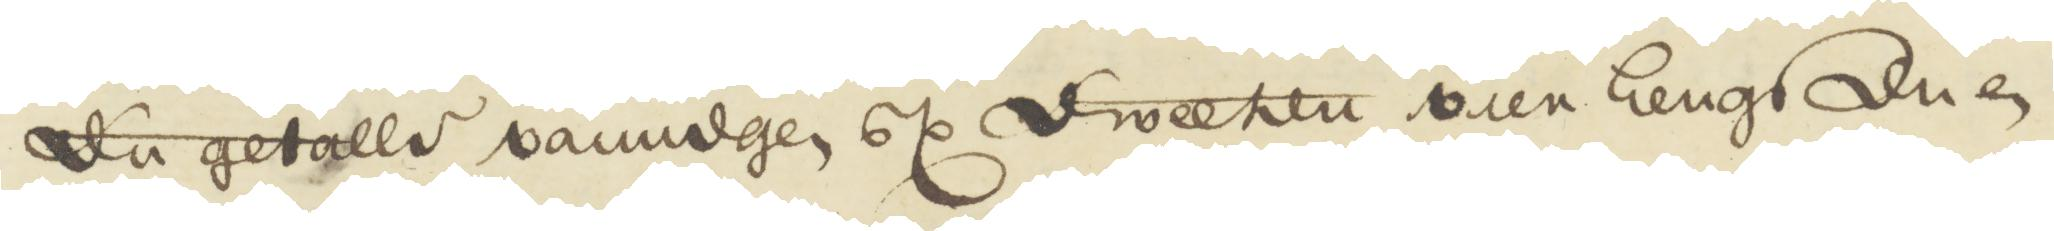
ten getalle van negen stx te weeten vier hengsten en
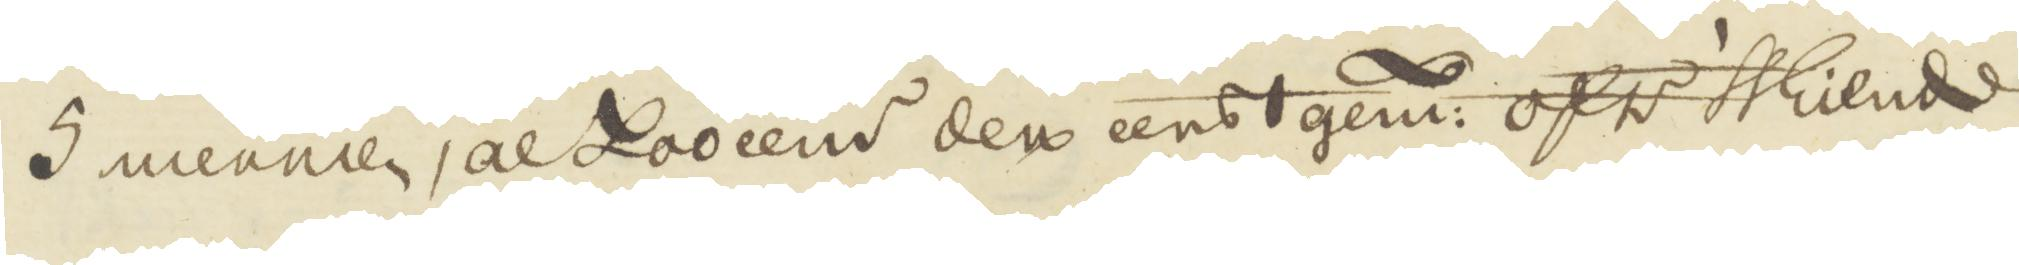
5 merrien, alzoo eene der eerstgem: ofte 's thiende
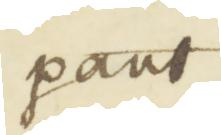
part
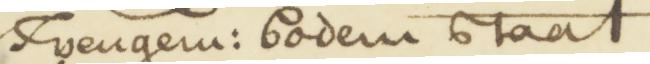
Evengem: bodem staat
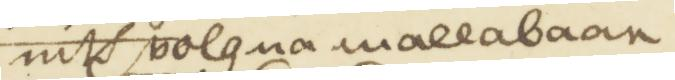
in't vervolg na mallabaar
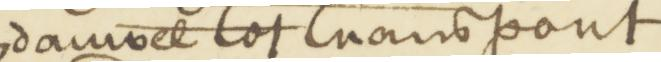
danwel tot transport
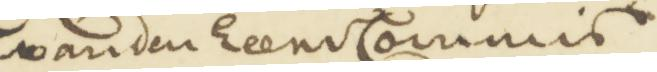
van den heere Commis
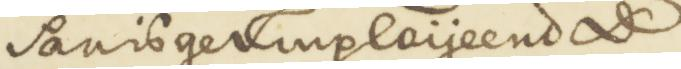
saris geemploijeerd te
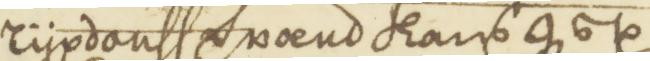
rijxdorff vervoerd thans 9 stx
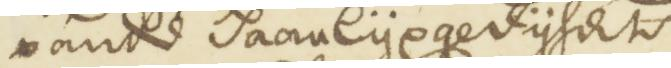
vande Iaarlijx geeijschte
